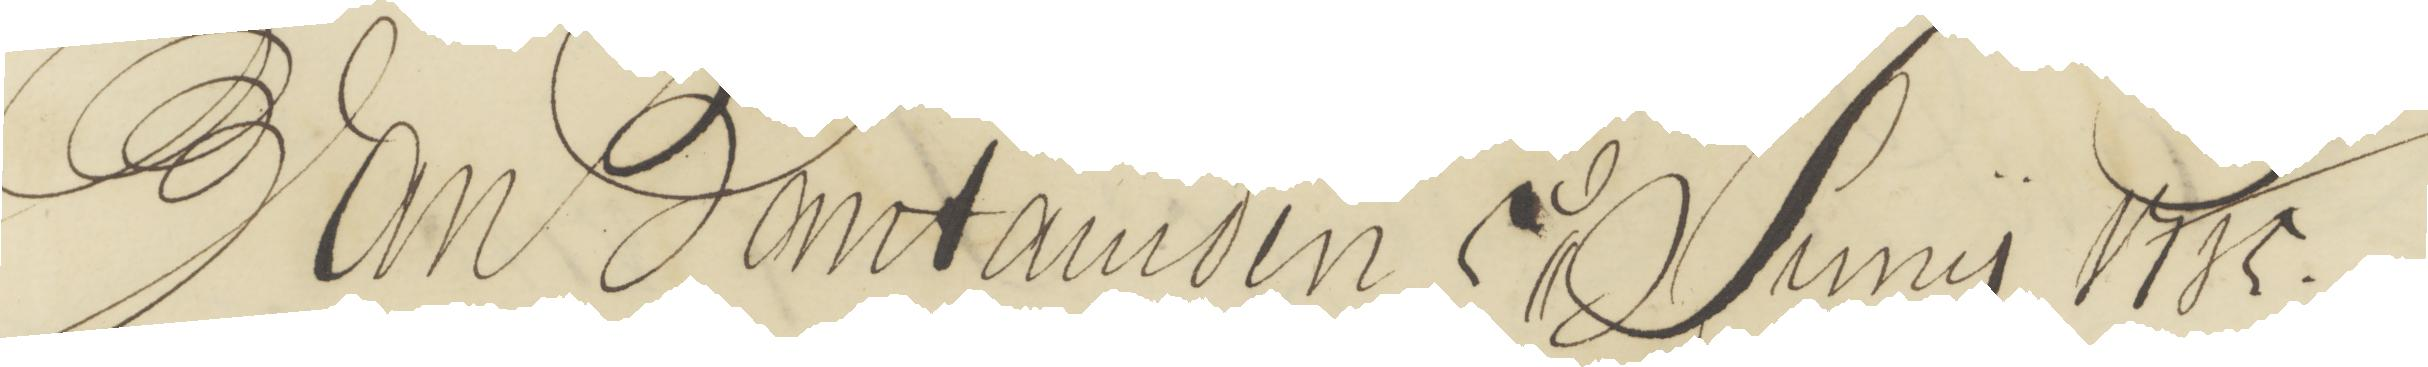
Van Bantam den 5„' Junij 1715.
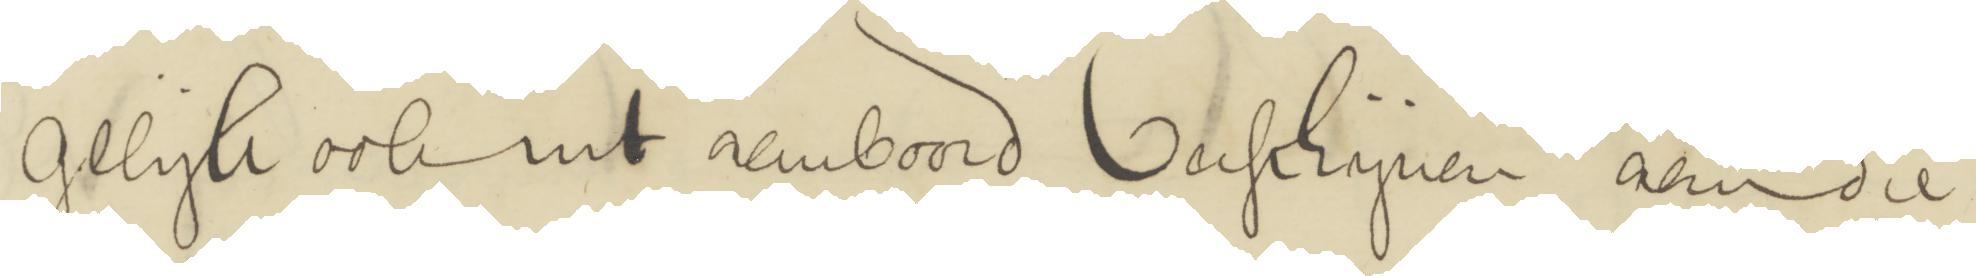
gelijk ook int aanboord verschijnen aan die
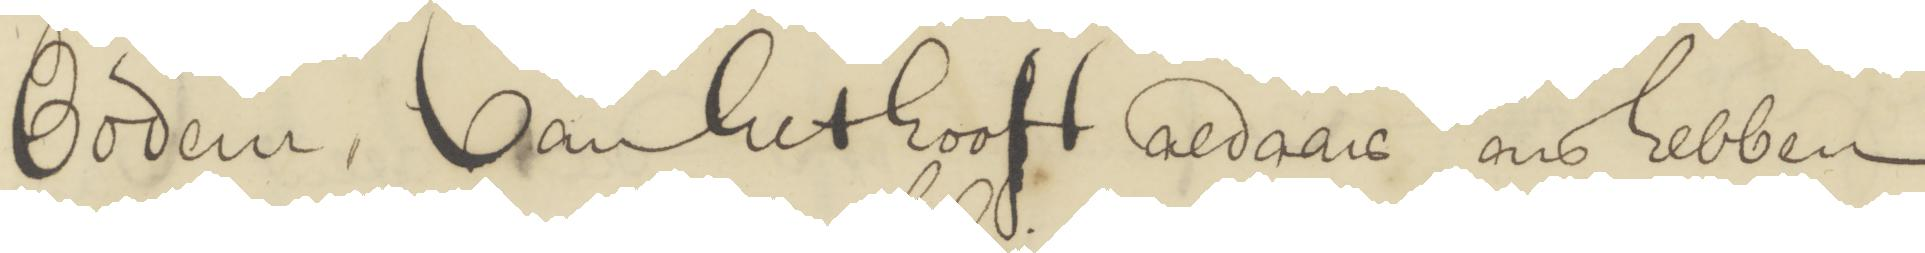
bodem, van het hooft aldaar ons hebben
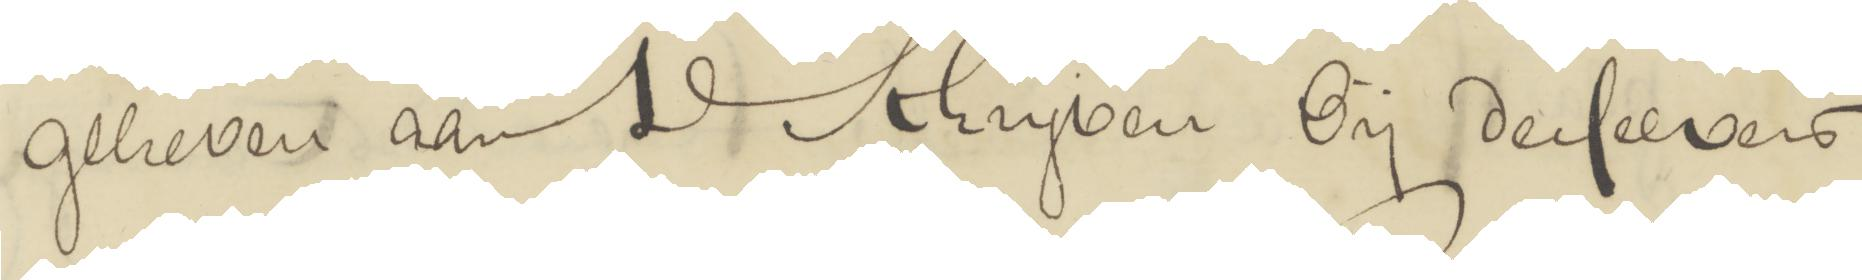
gelieven aan te schrijven bij derselvers
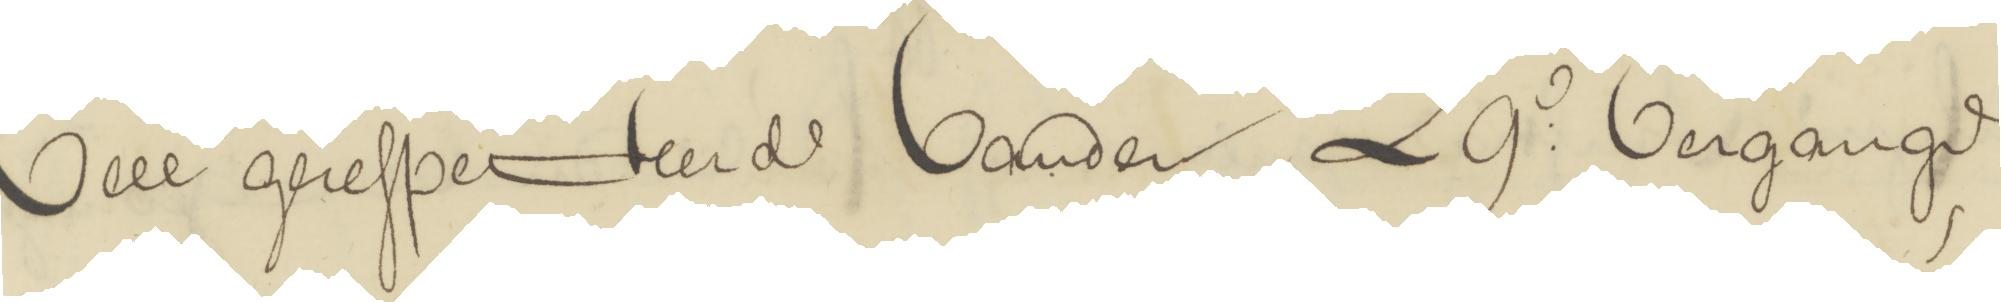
veel gerespecteerde vanden 29:' vergange
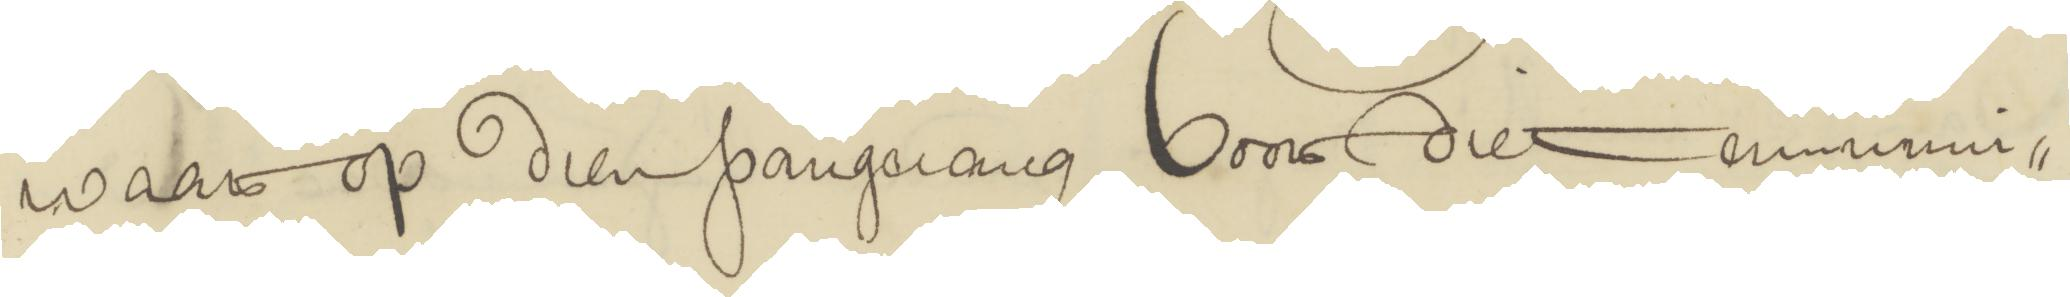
waar op dien pangerang voor die communi„
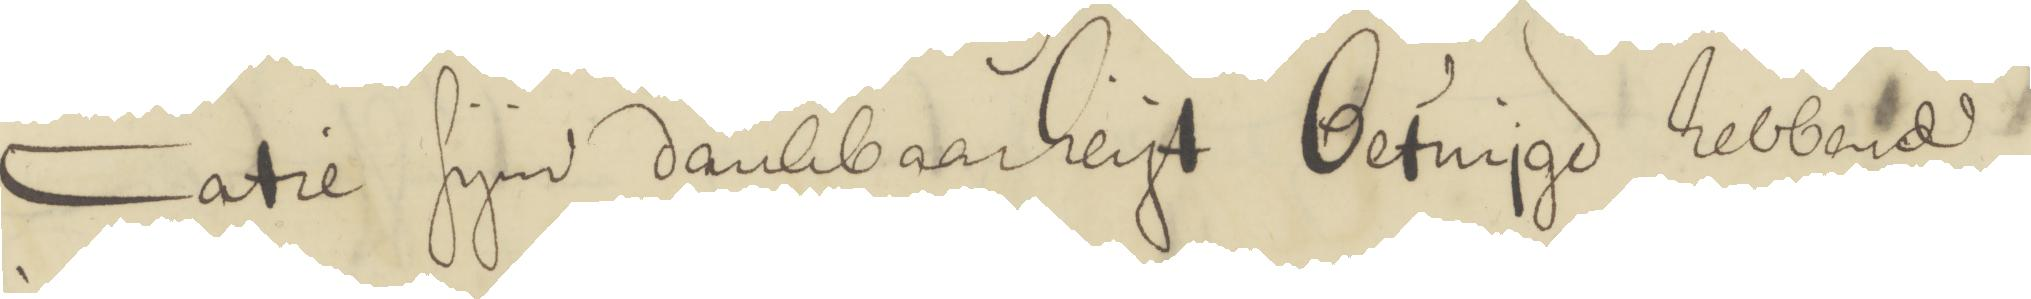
catie sijne dankbaarheijt betuijgd hebbende
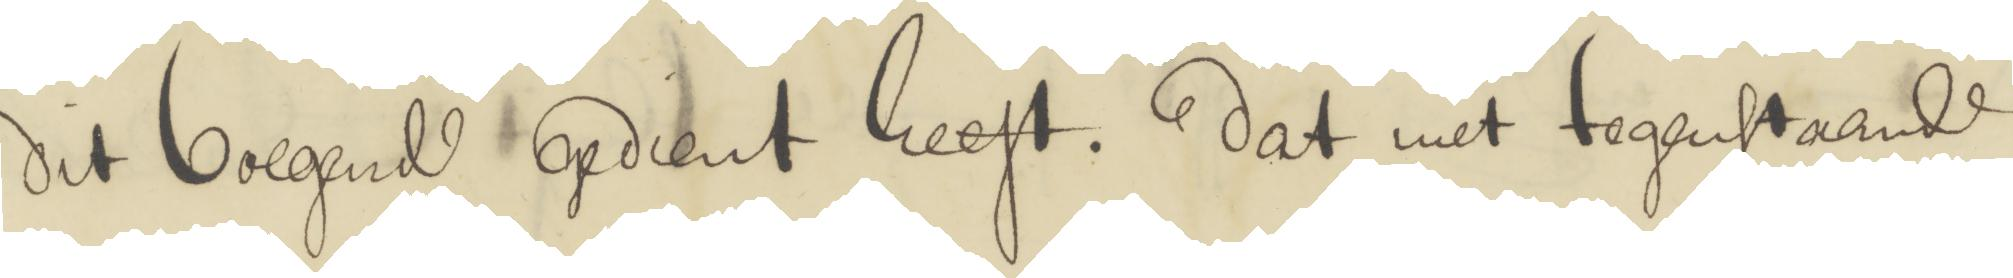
dit volgende gedient heeft. dat niet tegenstaande
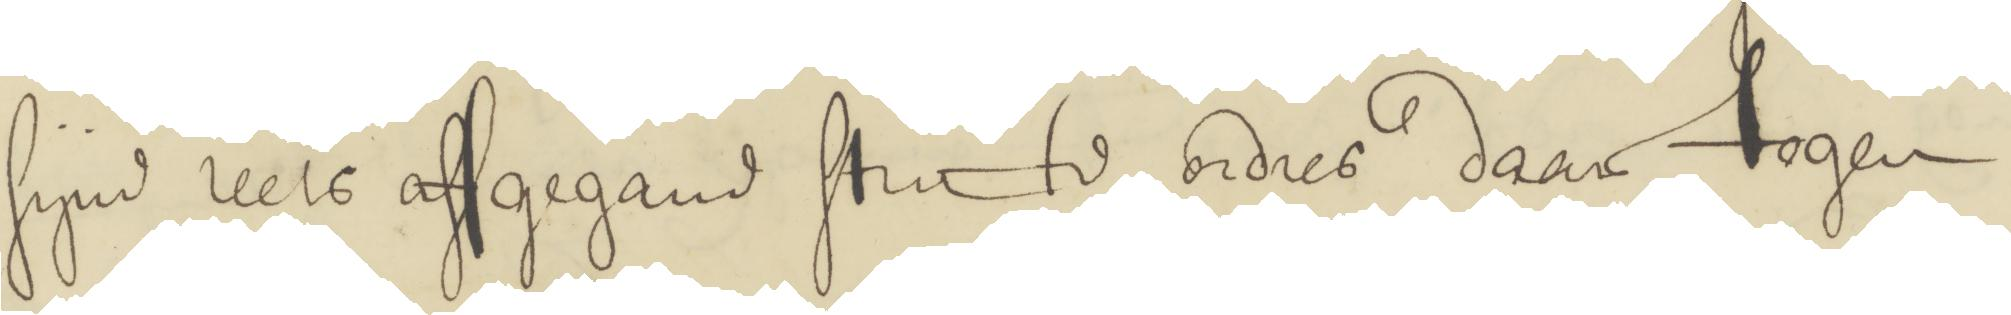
sijne reets affgegane stricte ordres daar tegen
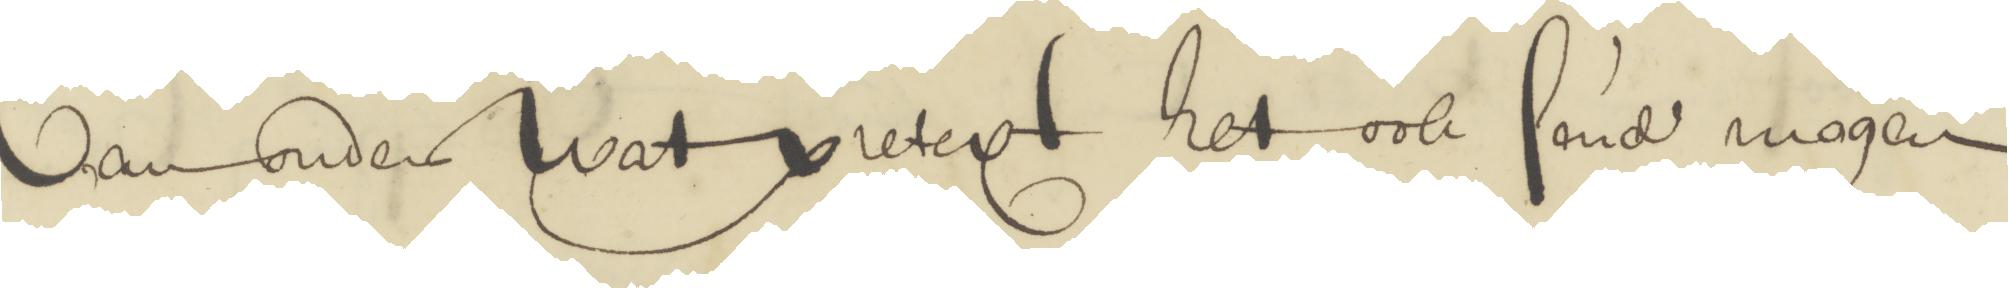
van onder wat pretext het ook soude mogen
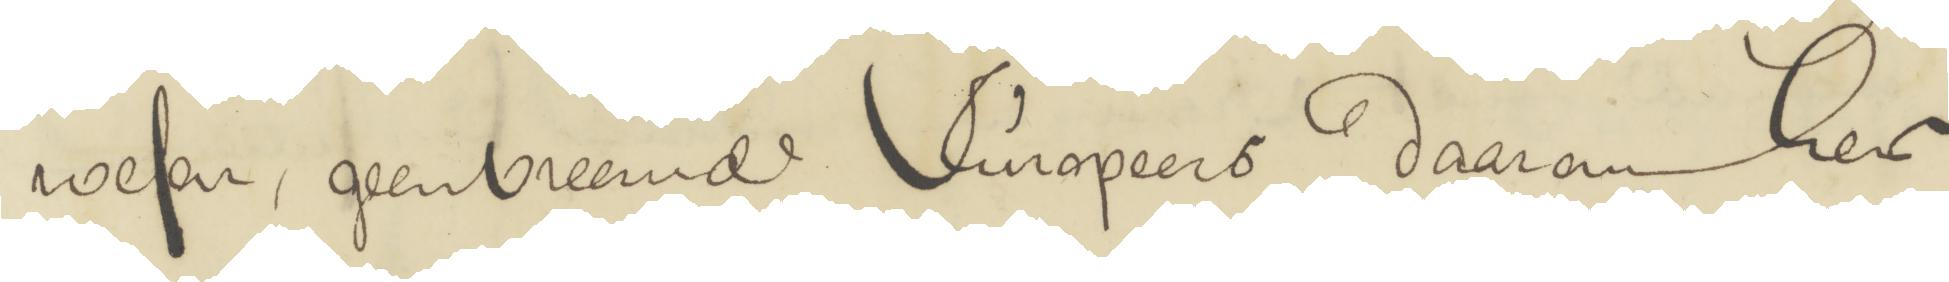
wesen, geen vreemde Europeers daar om her
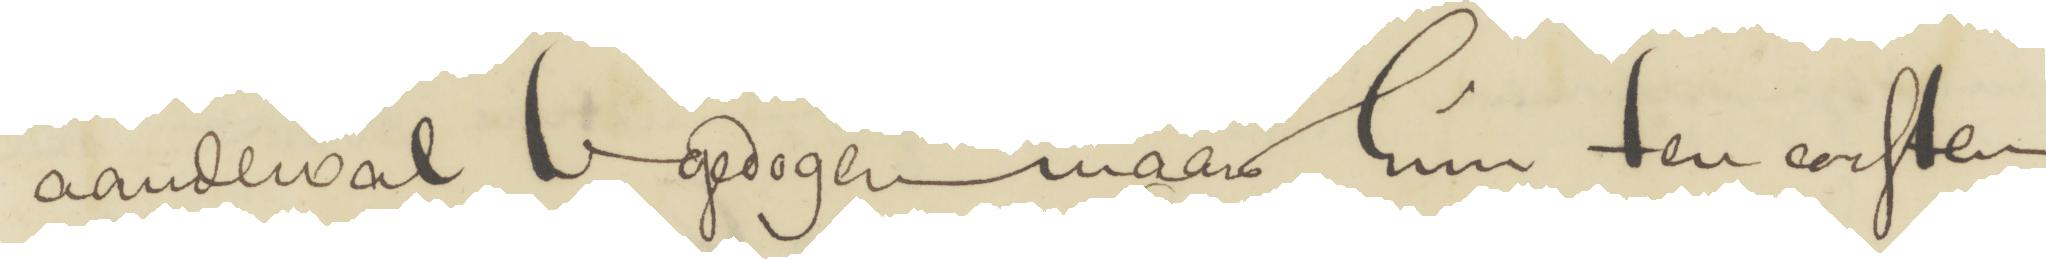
aandewal te gedogen maar hun ten eersten
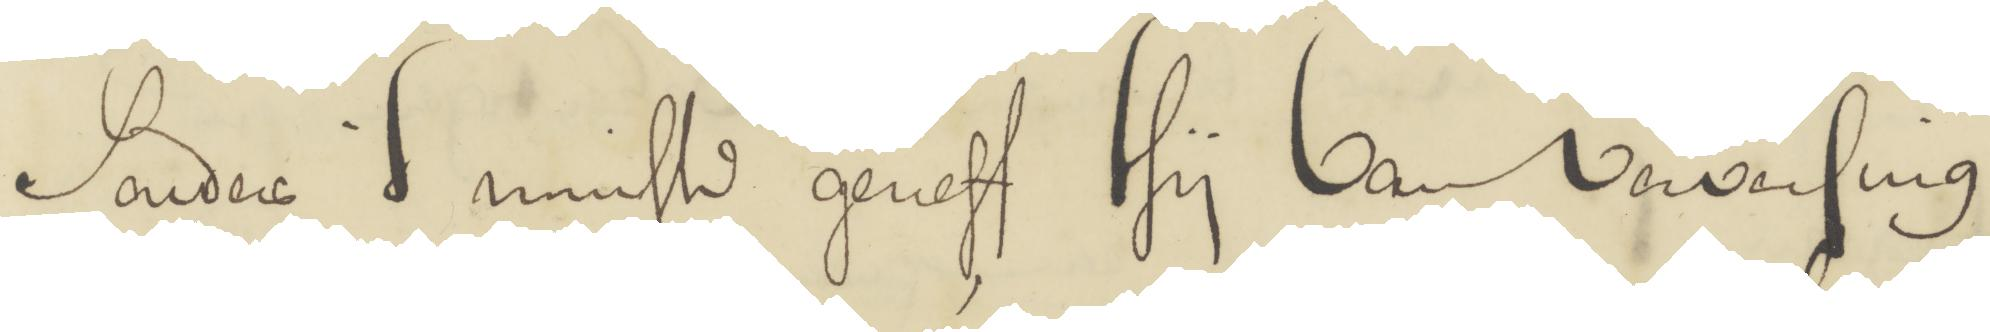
sonder ’t minste gerieff tsij van verversing
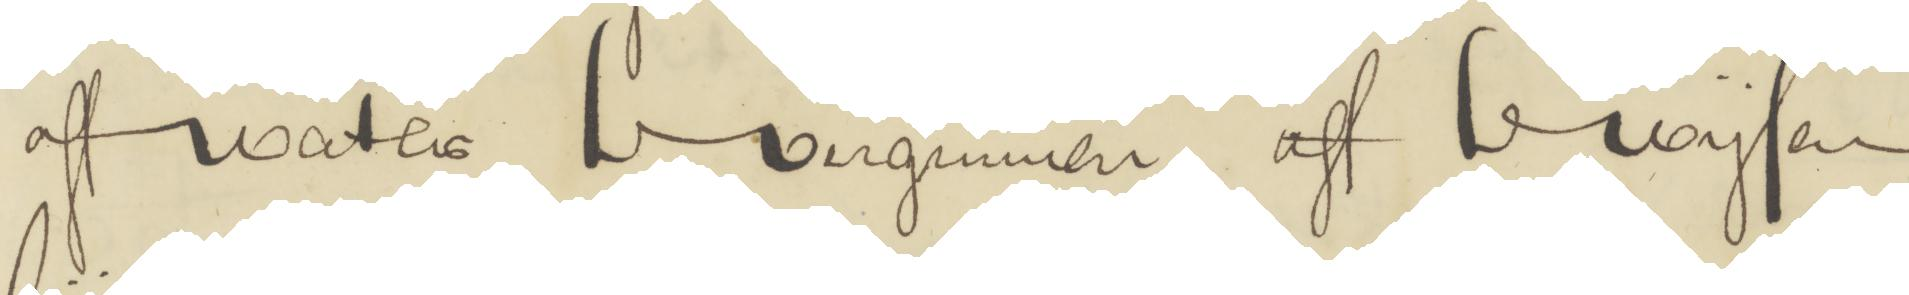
off water te vergunnen„ off te wijsen
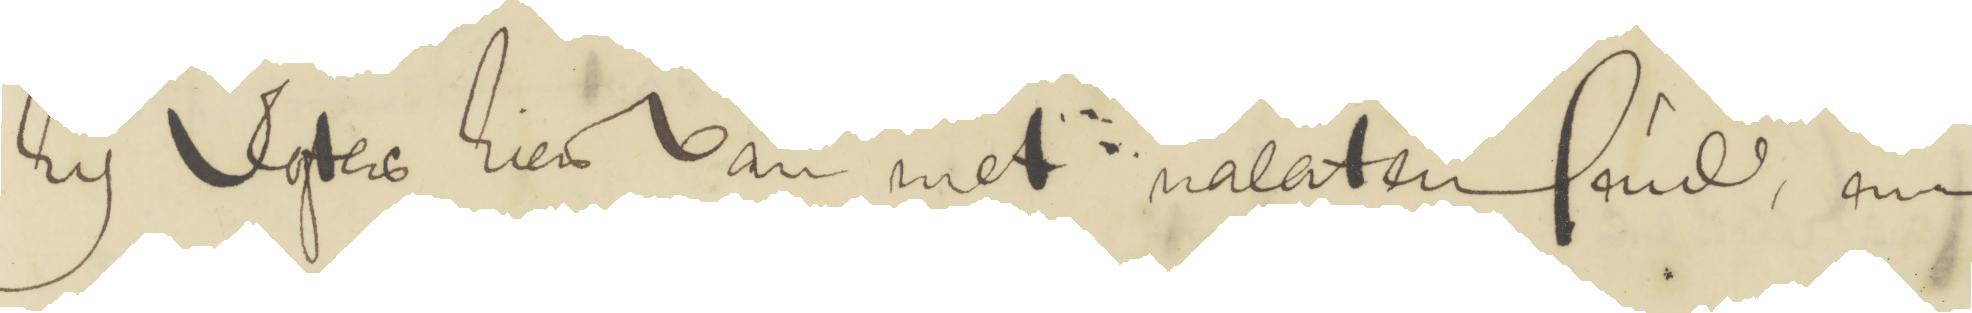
hij Egter hier van niet nalaten soude, om
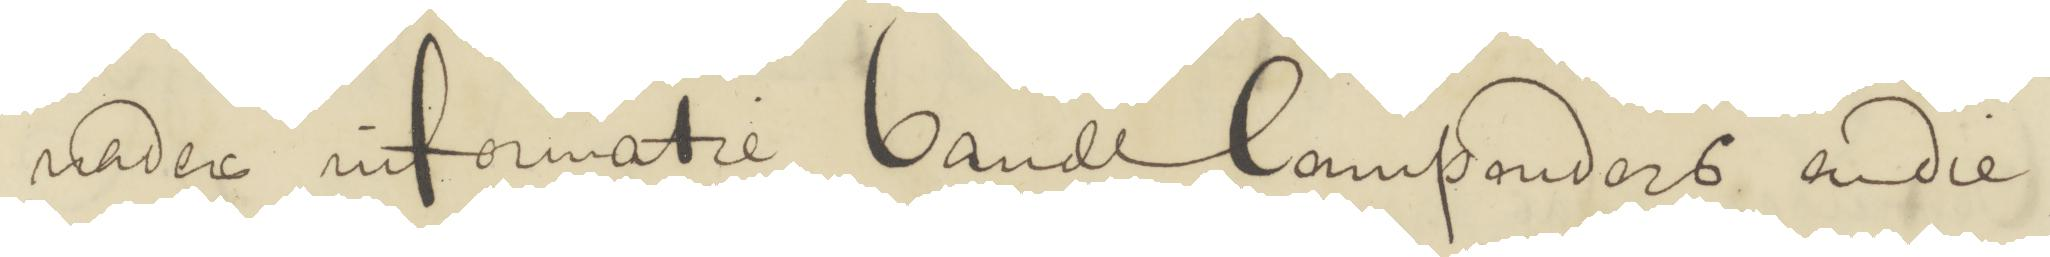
nader informatie vande lamponders en die
